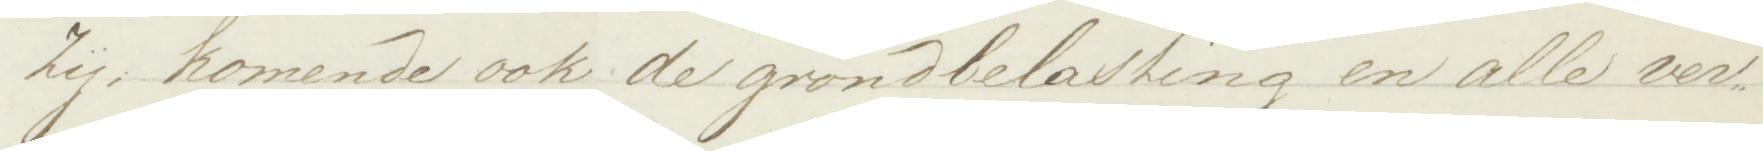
zij; komende ook de grondbelasting en alle ver„
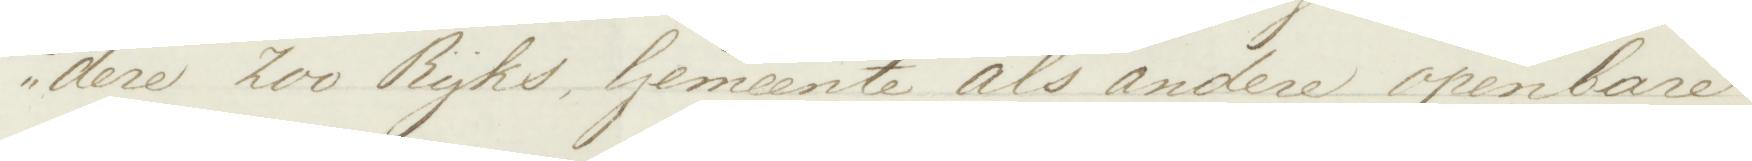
„dere zoo Rijks, Gemeente als andere openbare
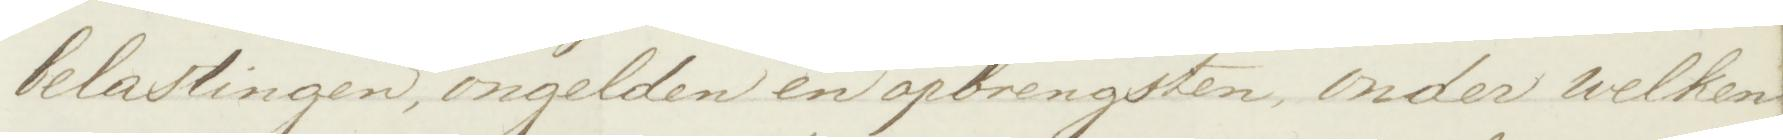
belastingen, ongelden en opbrengsten, onder welken
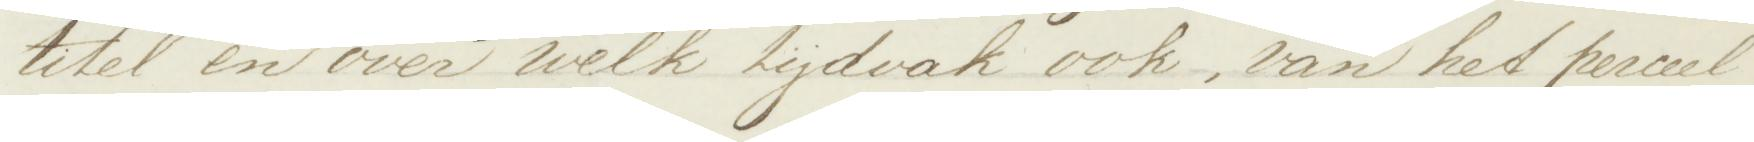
titel en over welk tijdvak ook, van het perceel
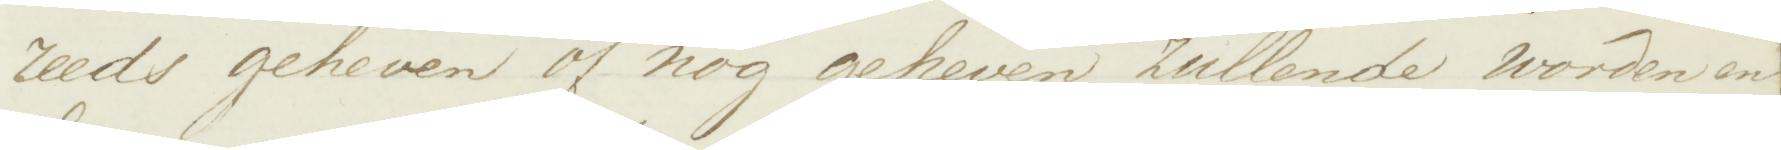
reeds geheven of nog geheven zullende worden en
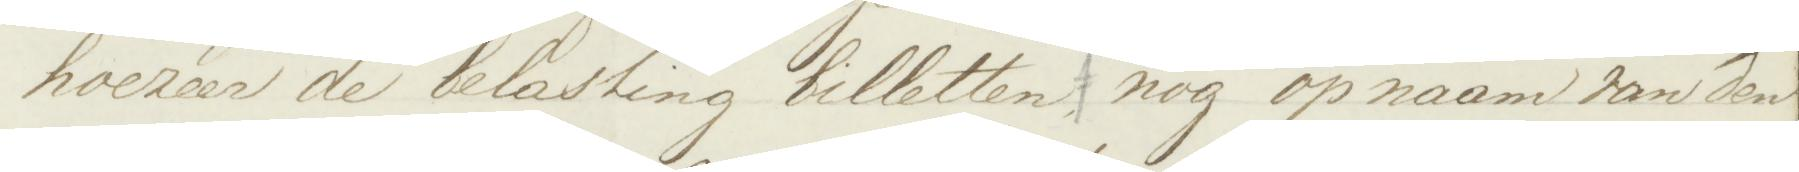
hoezeer de belasting billetten, | nog op naam van den
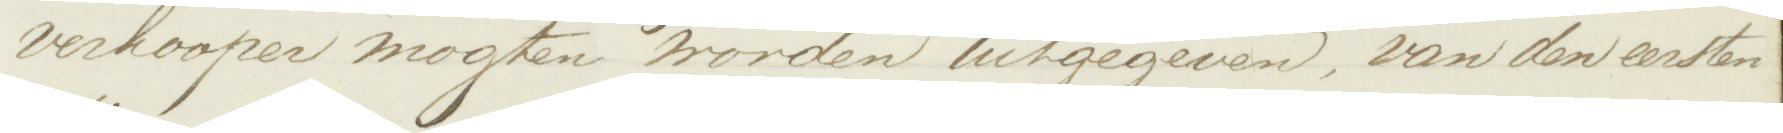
verkooper mogten worden uitgegeven, van den eersten
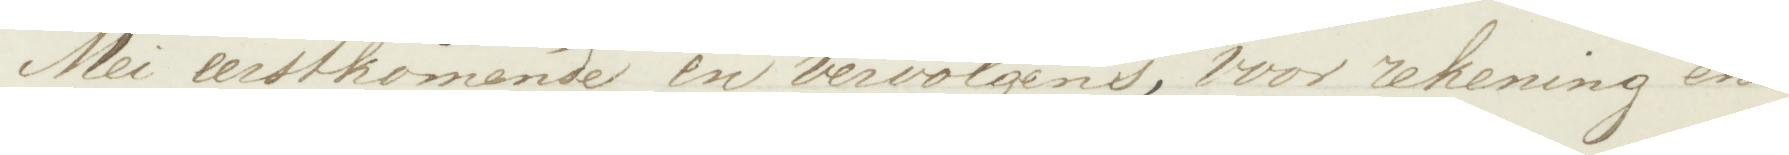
Mei eerstkomende en vervolgens, voor rekening en
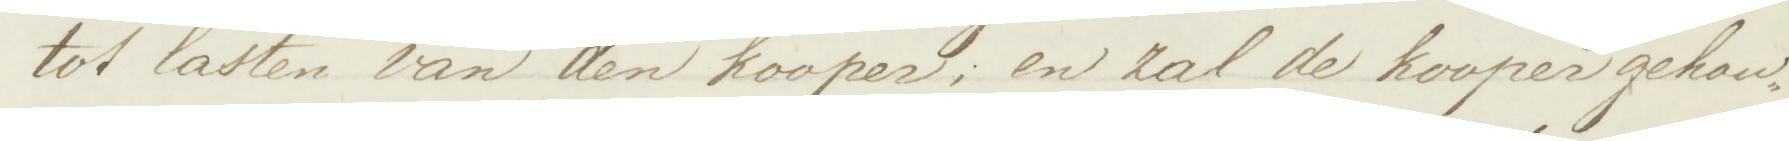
tot lasten van den kooper; en zal de kooper gehou„
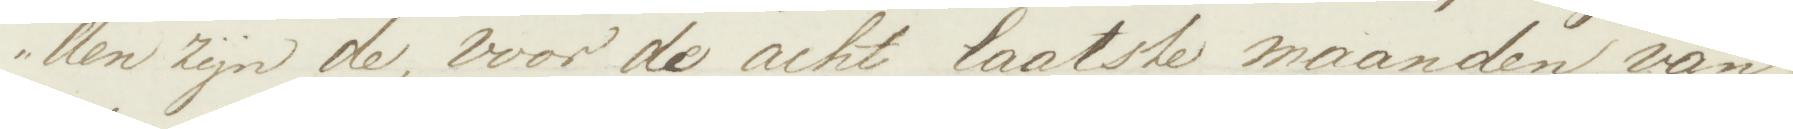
„den zijn de, voor de acht laatste maanden van
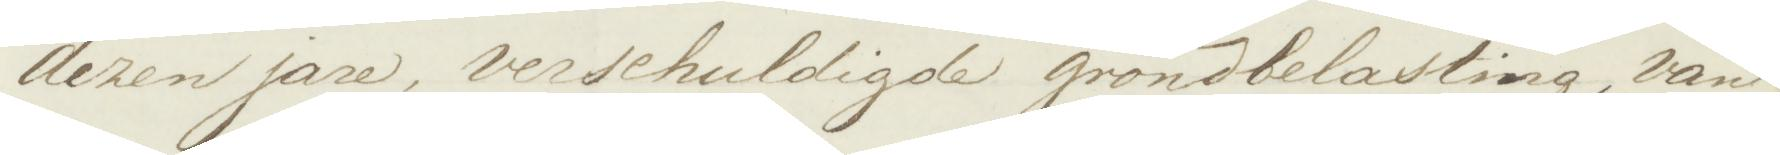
dezen jare, verschuldigde grondbelasting, van
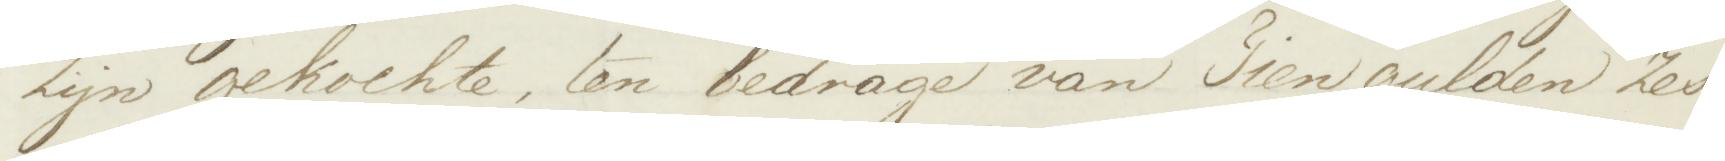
zijn gekochte, ten bedrage van Tien gulden zes
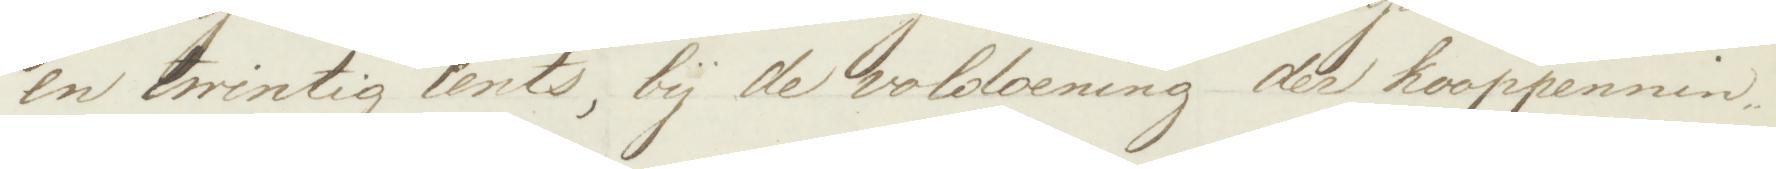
en twintig Cents, bij de voldoening der kooppennin„
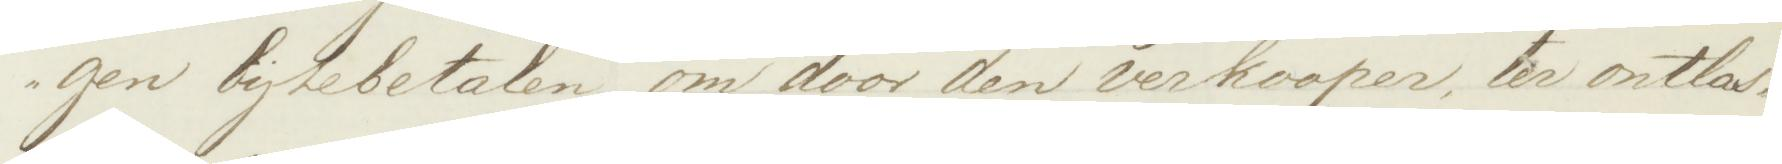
„gen bijtebetalen, om door den verkooper, ter ontlas„
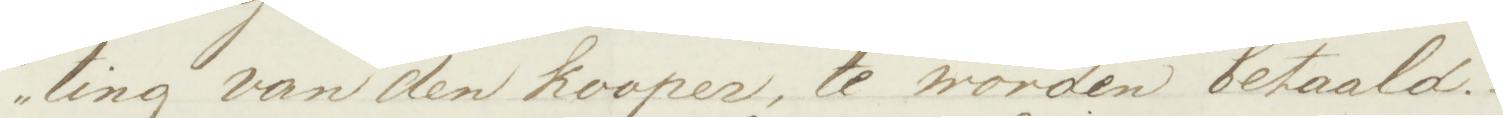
„ting van den kooper, te worden betaald. —
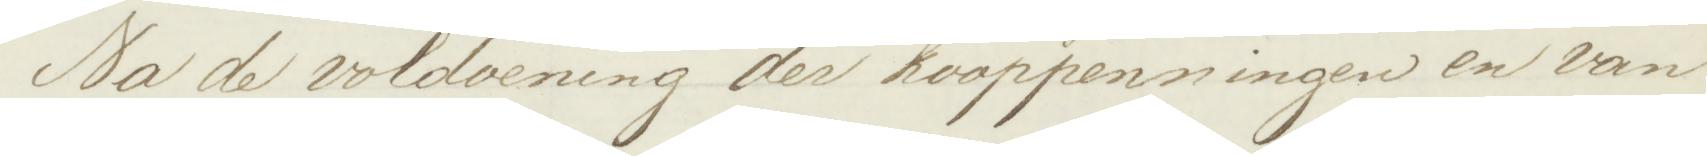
Na de voldoening der kooppenningen en van
